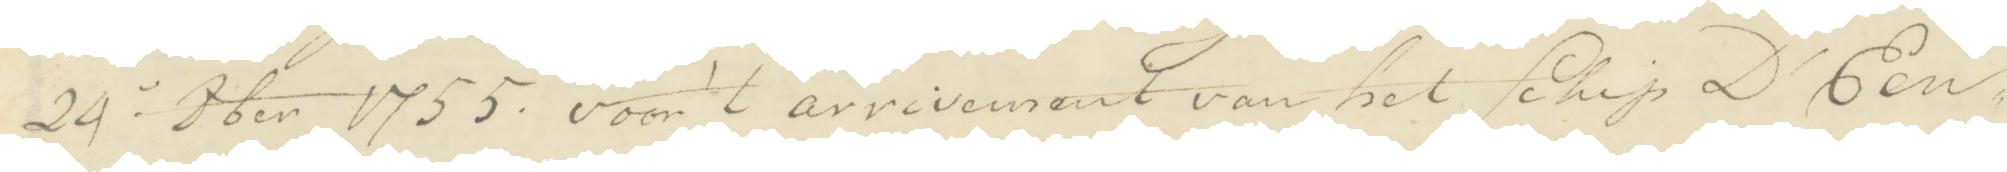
24.' 8ber 1755. voor ’t arrivement van het schip D' Een„
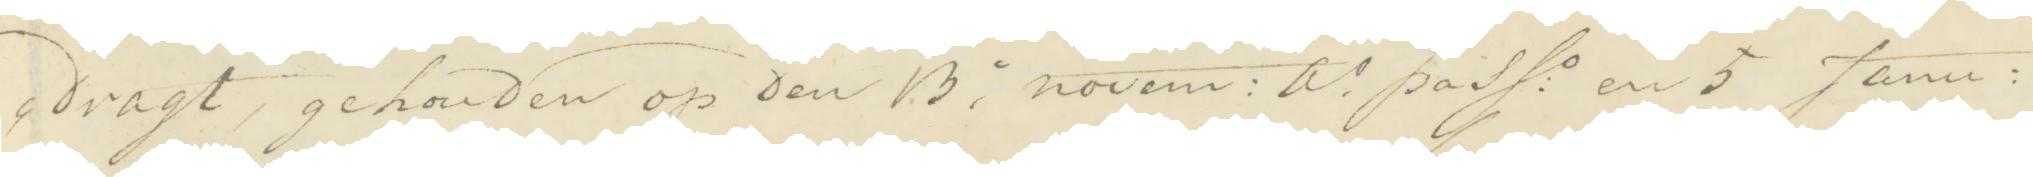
„dragt, gehouden op den 13,e novem: A:o pass:o en 5 Janu:
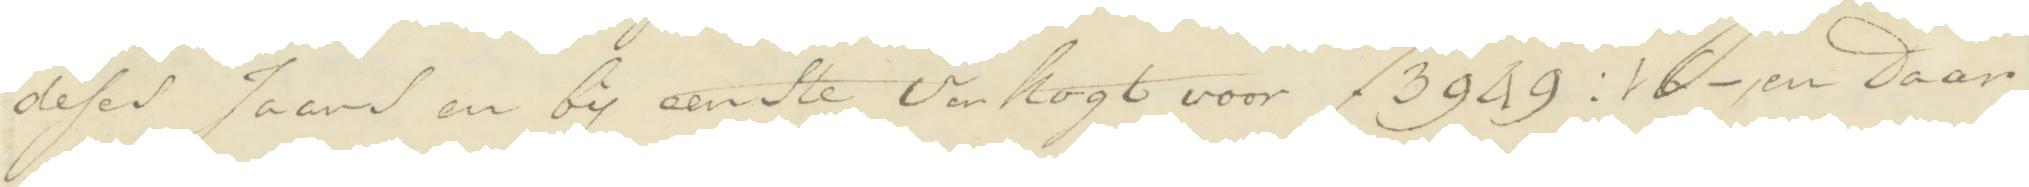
deses Jaars en bij eerste verkogt voor ƒ3949:16-, en daar
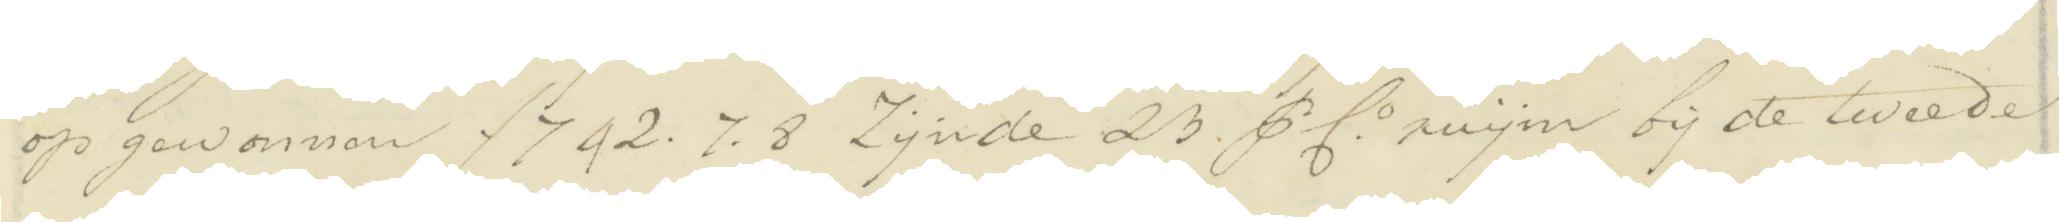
op gewonnen ƒ742.7.8 zijnde 23. pr C.o ruijm bij de tweede
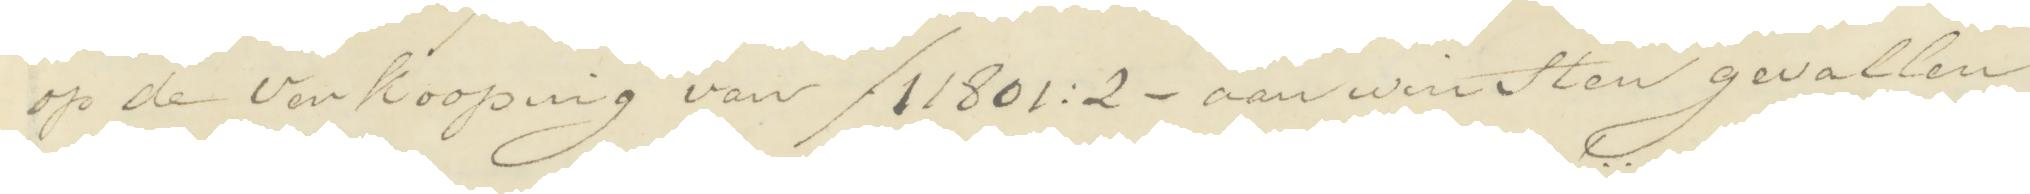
op de verkooping van ƒ11801:2- aan winsten gevallen
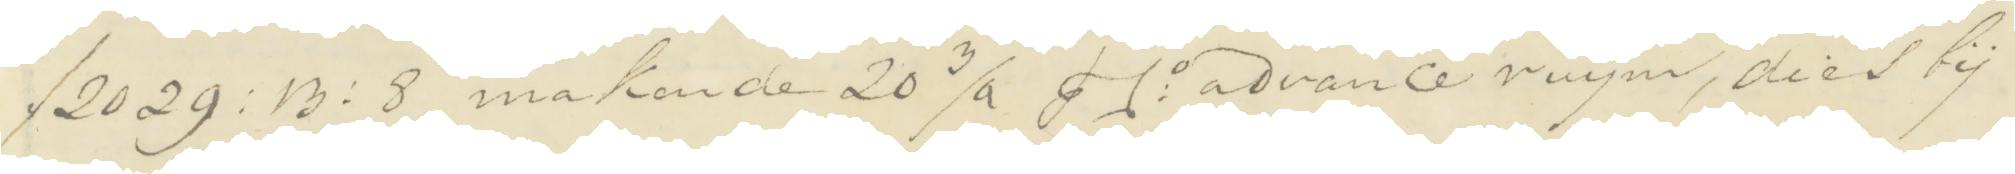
ƒ2029:13:8 makende 20¾ p C:o advance ruijm, dies bij
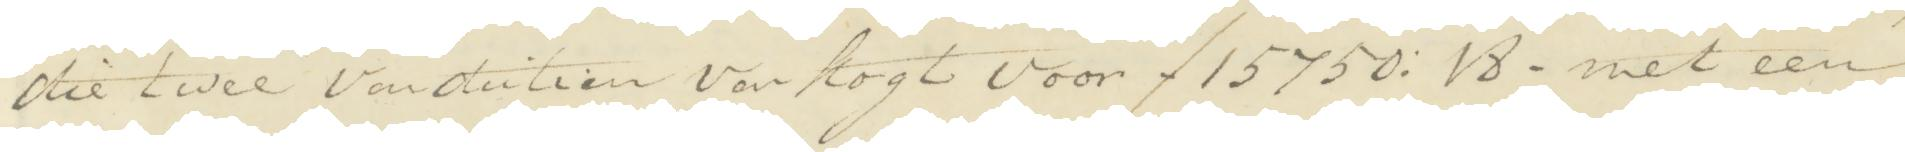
die twee vendutien verkogt voor ƒ15'750:18-met een
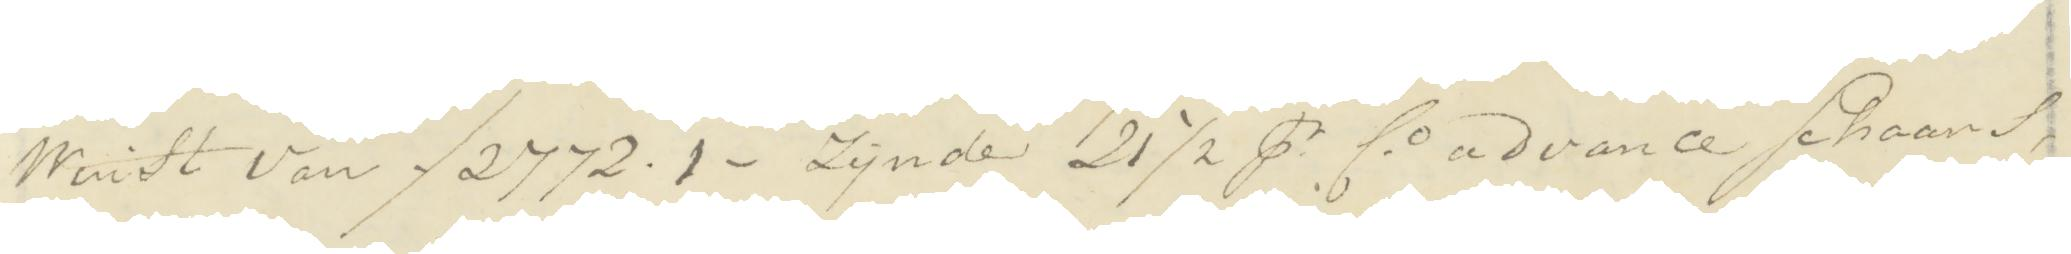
Winst van ƒ2772.1 - zijnde 21½ p.r C.o advance schaars,
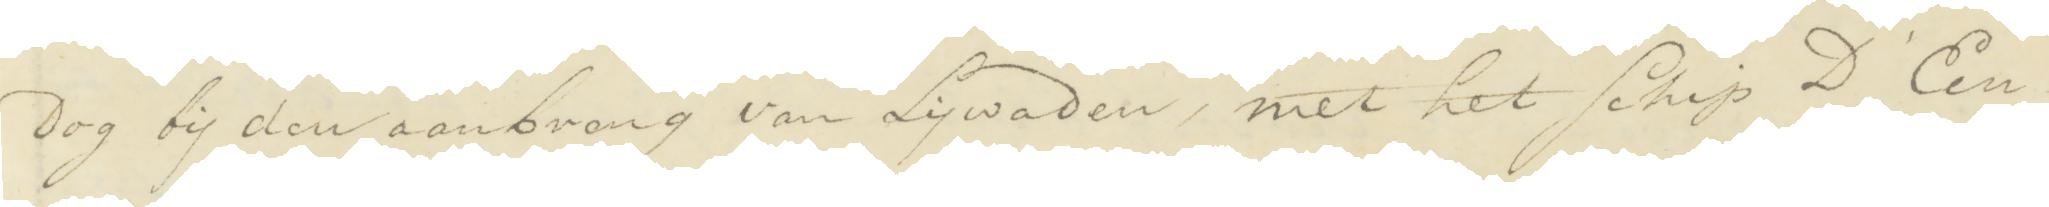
dog bij den aanbreng van Lijwaden, met het schip D' Een
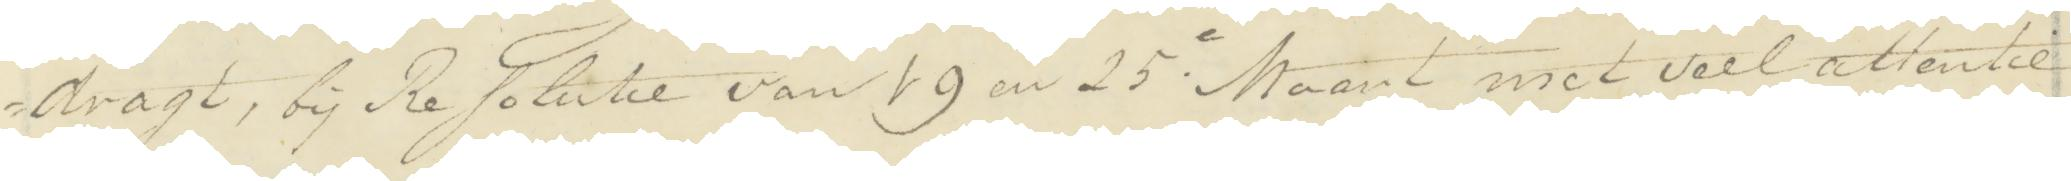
=dragt, bij Resolutie van 19 en 25.e Maart met veel attentie
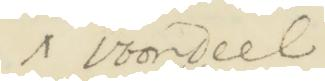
^ voordeel
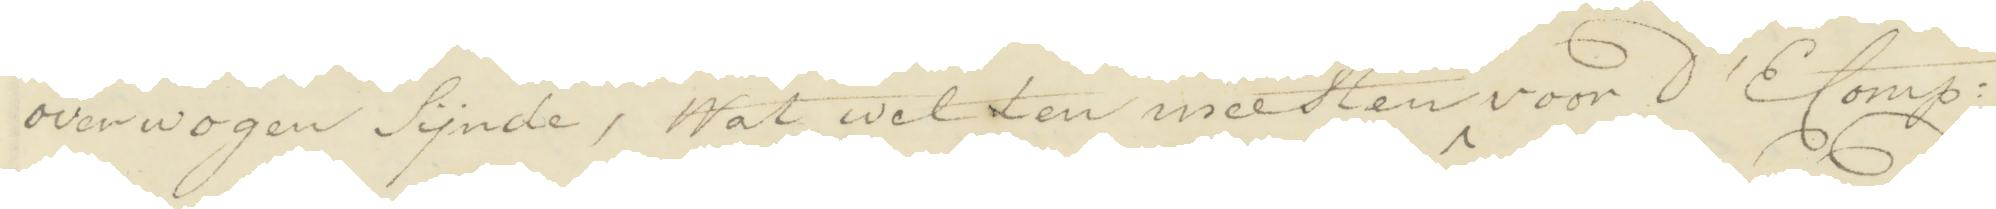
overwogen sijnde, wat wel ten meesten ^ voor d' EComp:
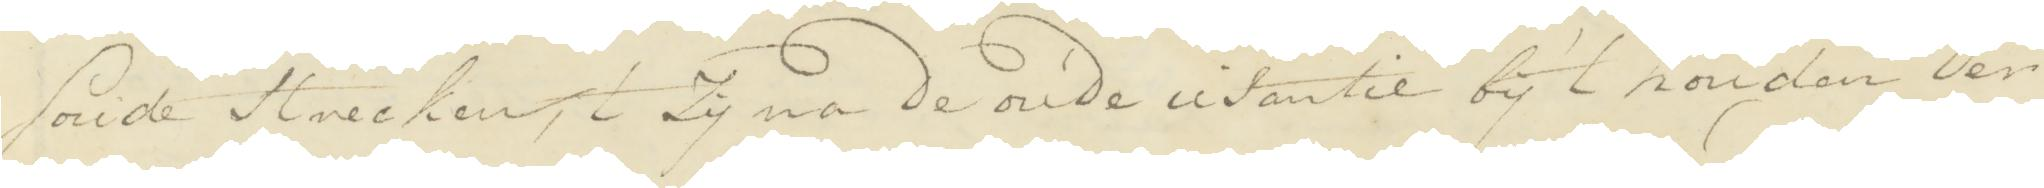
soude strecken, t zij na de oude usantie bij ’t houden der
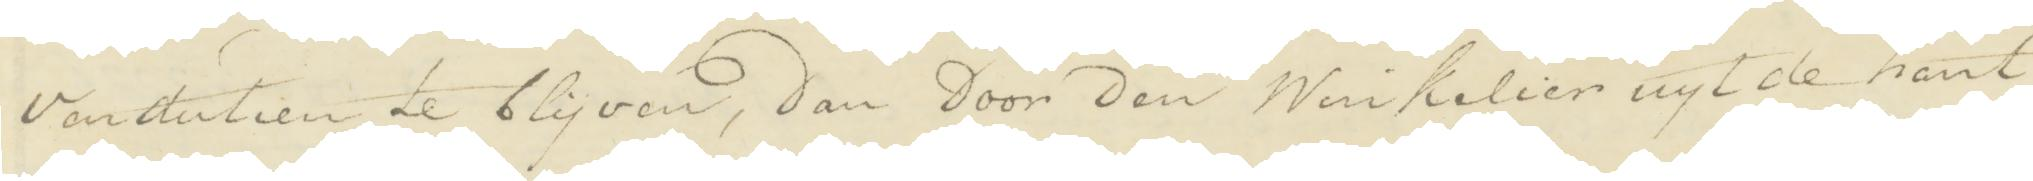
vendutien te blijven, dan door den Winkelier uijt de hant
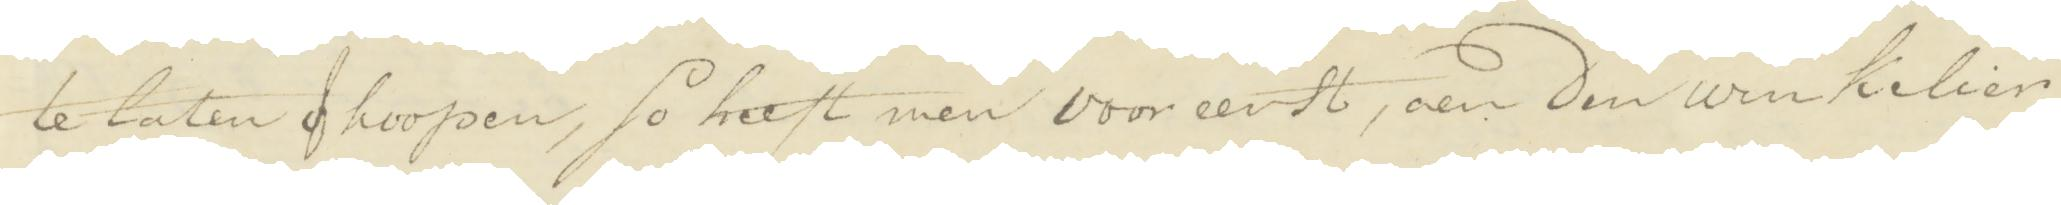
te laten verkoopen, so heeft men voor eerst, aen den winkelier
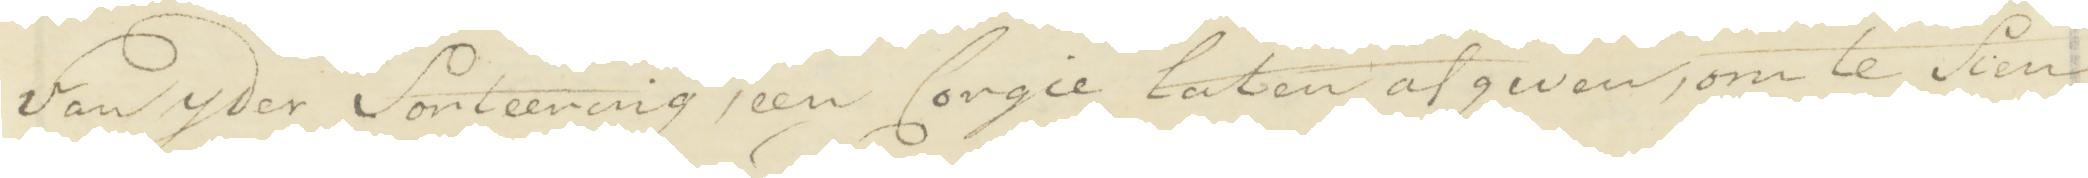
van yder sorteering, een Corgie laten afgeven, om te sien
